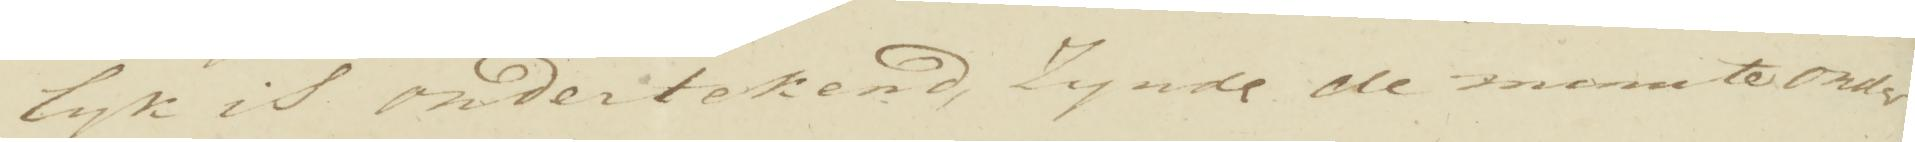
lyk is ondertekend, zynde de minute onder
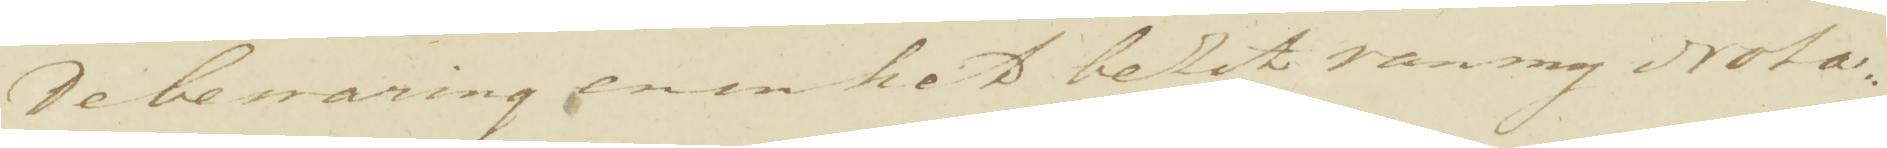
de bewaring en in het bezit van my Nota„
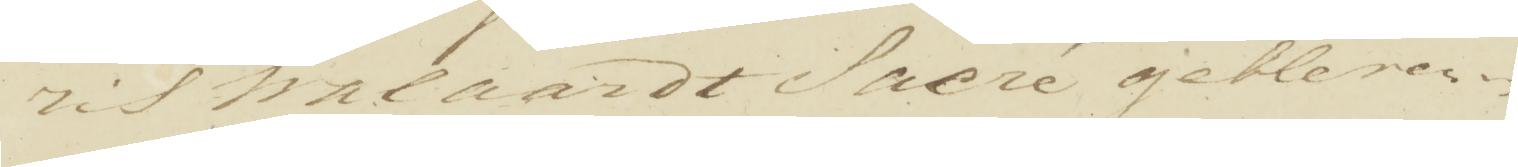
ris walaardt Sacré gebleven
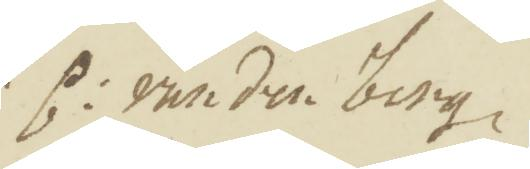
J: C: van den berg
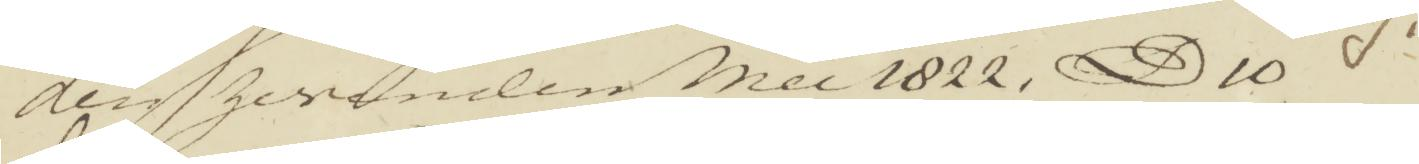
den zevenden Mei 1822, D 10
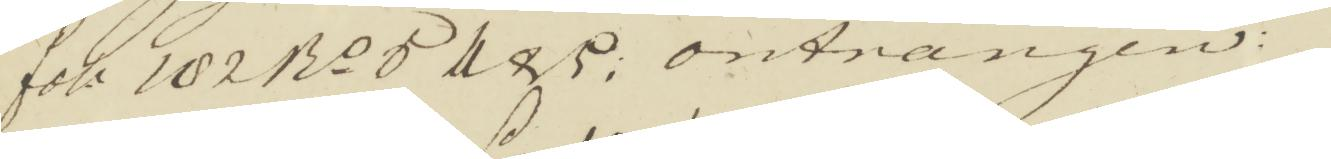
fol.o 182 R=o V 4 & 5; ontvangen:
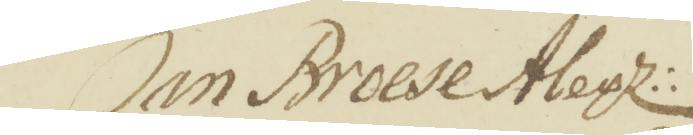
Jan Broese Alexz.:
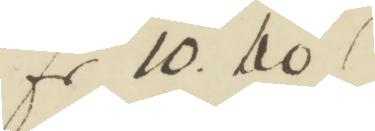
fr 10. 40
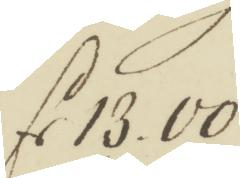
fr 13. 00
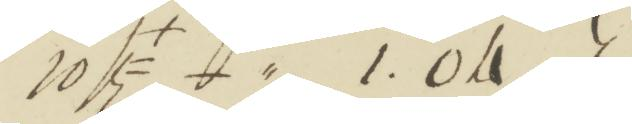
10 /c=t – „ 1. 04
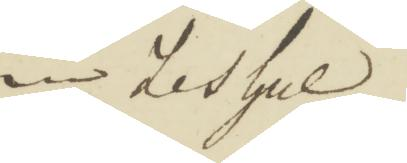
Zes Gul
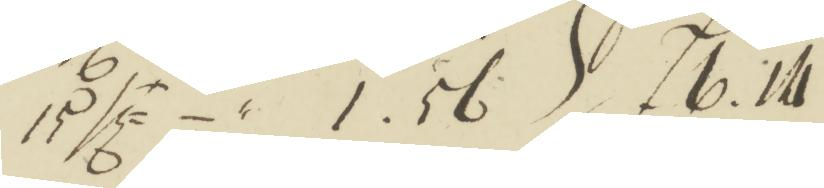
15 /c=t – „ 1. 56 ƒ6. 14
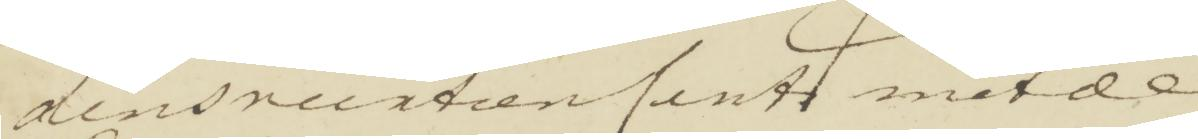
dens veertien Cents met de
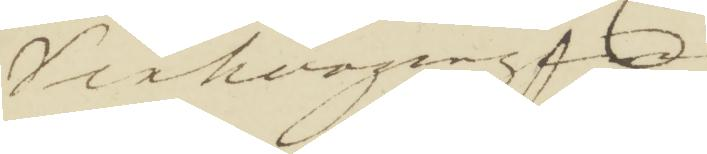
Verhoogingen
